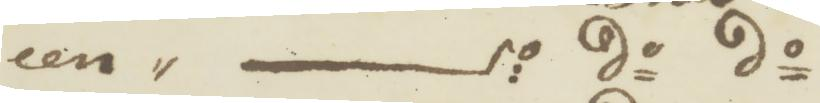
een „ _:o d=o d=o
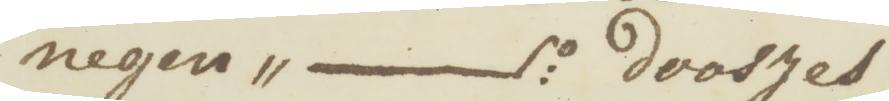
negen „ _:o doosjes
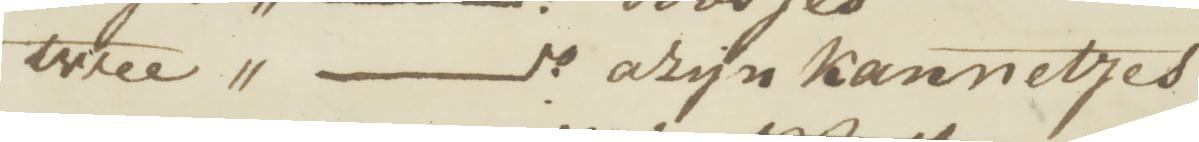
twee „ _:o azijn kannetjes
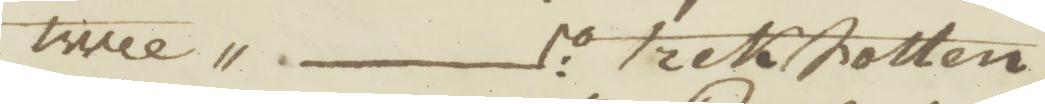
twee „ _:o trekpotten
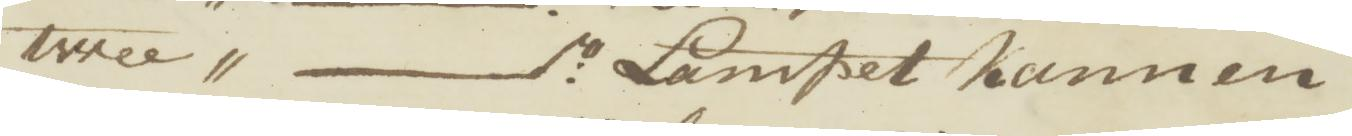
twee „ _:o Lampet kannen
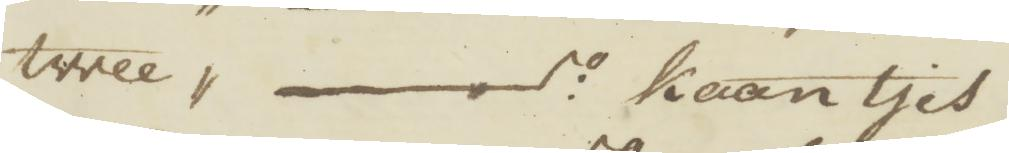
twee „ _:o kaantjes
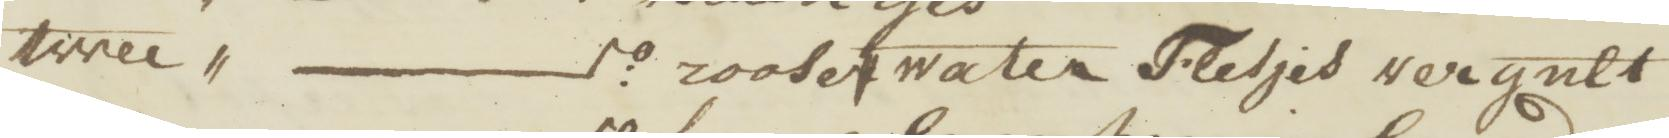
twee „ _:o rooser water Flesjes vergult
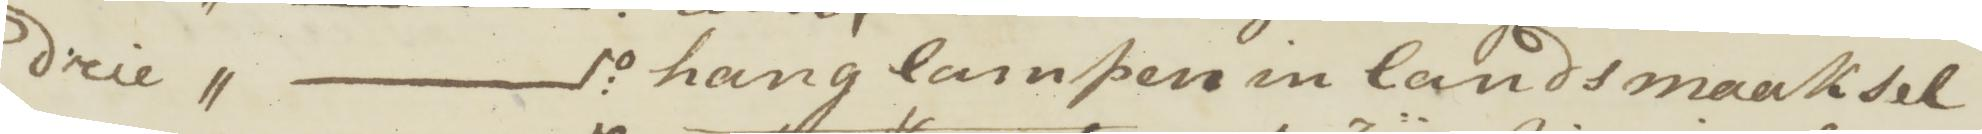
drie „ _:o hang lampen in lands maaksel
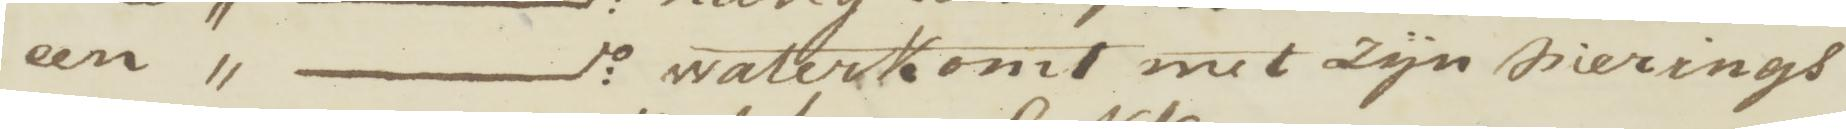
een „ _:o waterkomt met zijn pierings
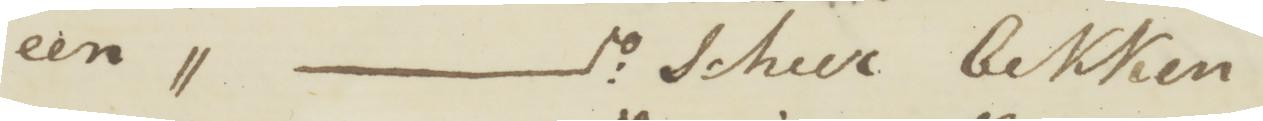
een „ _:o Scheer bekken
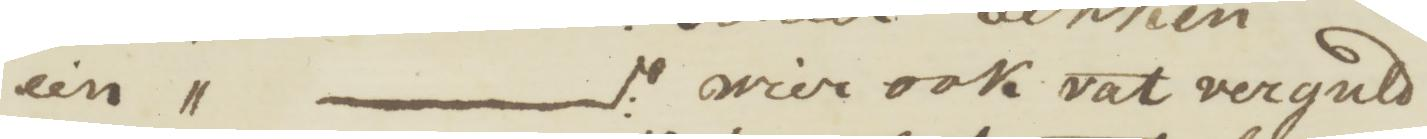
een „ _:o wier ook vat verguld
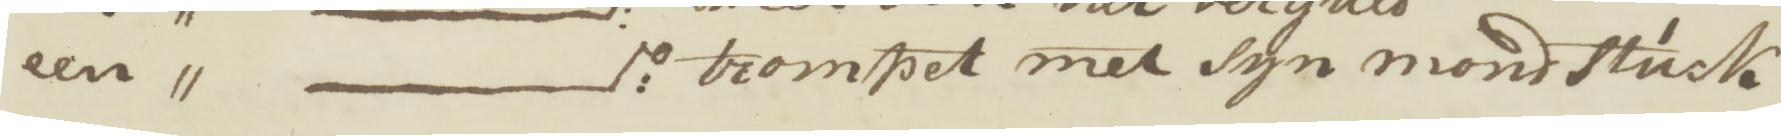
een „ _:o trompet met syn mond stuck
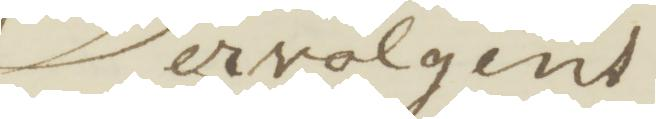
Vervolgens
